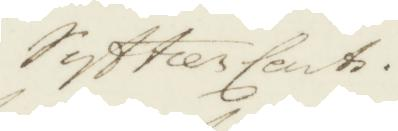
Vyftien Cents.
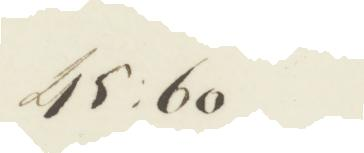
45:60
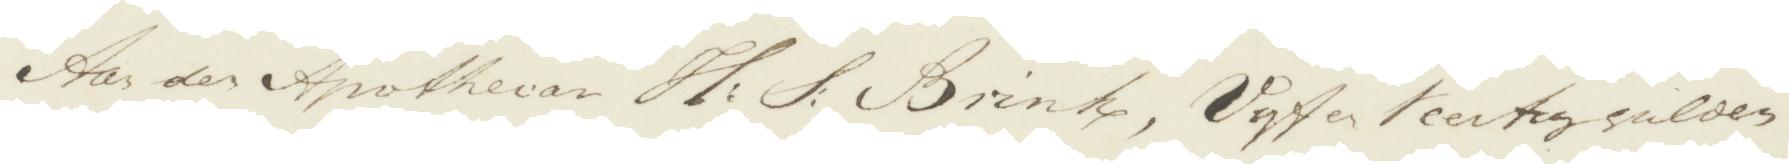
Aan den Apothecar H: S: Brink, Vyf en Veertig gulden
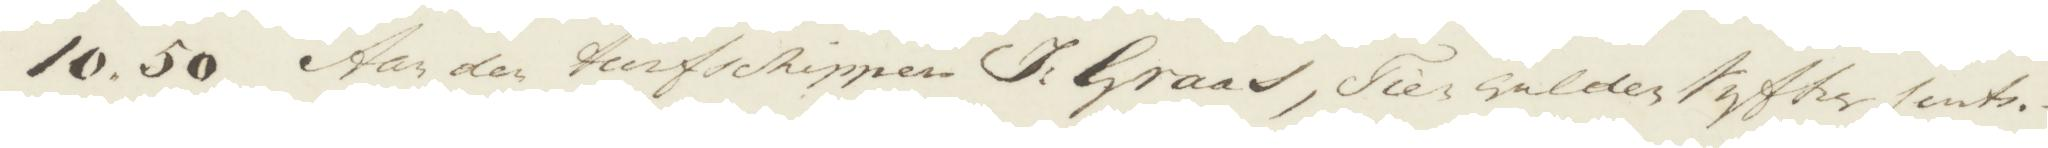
10. 50 Aan den turfschipper I: Graas, Tien Gulden Vyftig Cents.
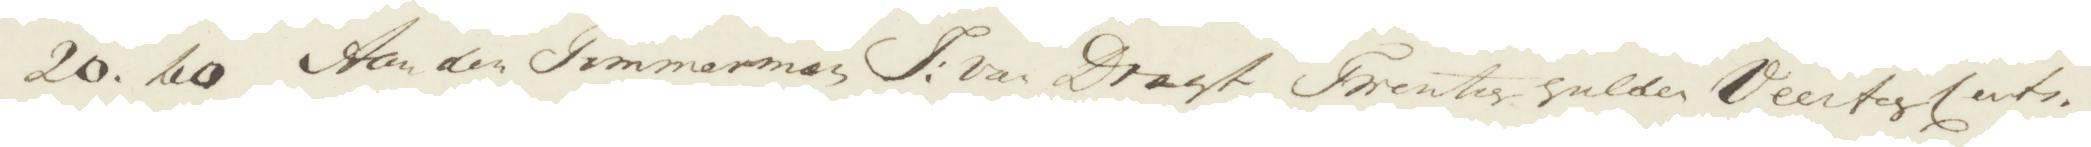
20. 40 Aan den Timmerman I: van Dragt Twintig gulden Veertig Cents.
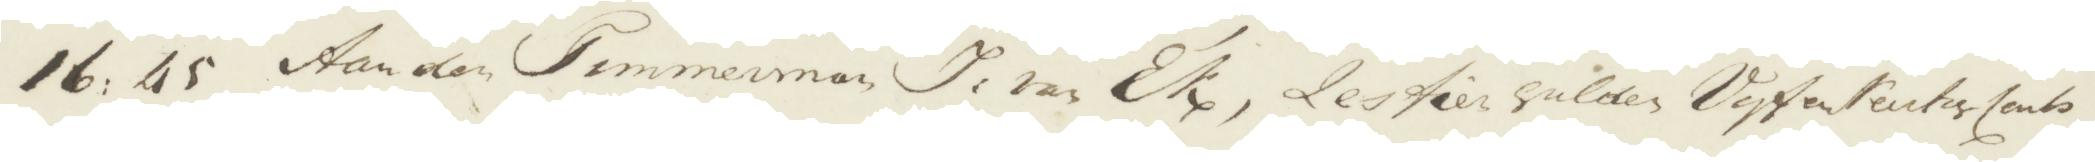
16: 45 Aan den Timmerman I: van Ek, Zestien gulden Vyfenveertig Cents
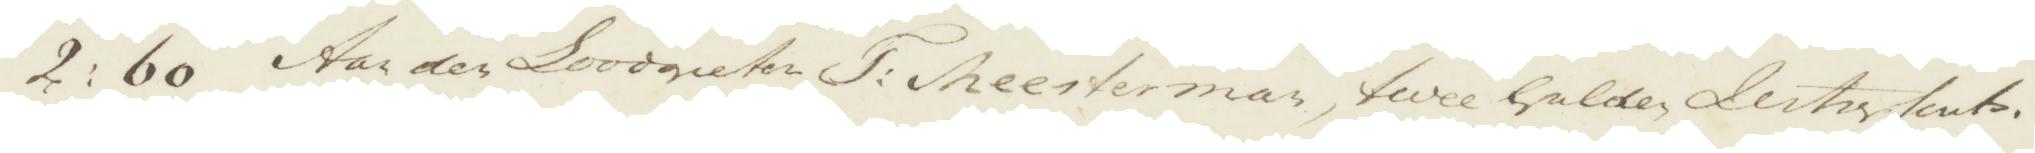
2: 60 Aan den Loodgieter T: Meesterman, twee Gulden Zestig Cents.
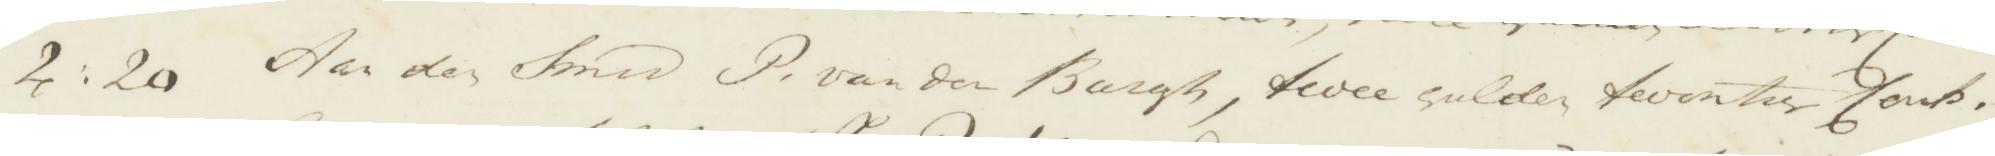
2: 20 Aan den Smid P. van den Burgh, twee gulden twintig Cents.
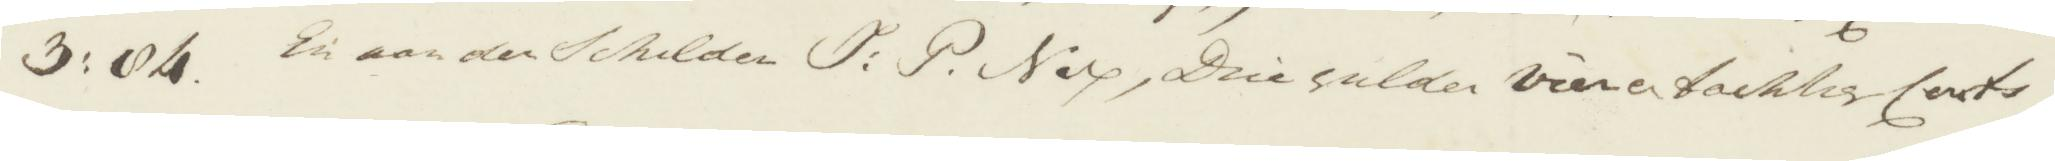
3: 84. En aan den Schilder I: P. Nix, Drie gulden vier en tachtig Cents
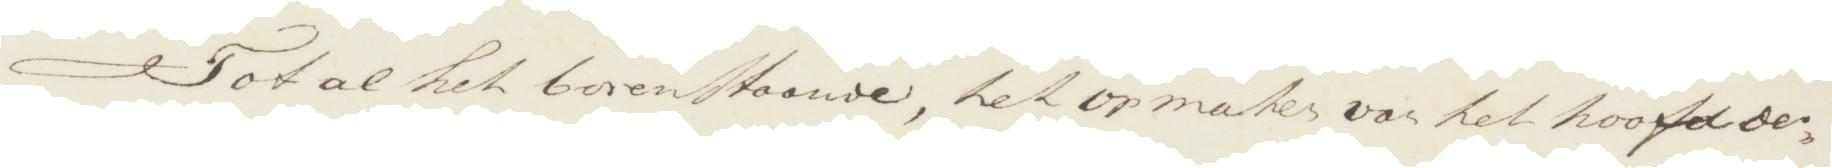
Tot al het bovenstaande, het opmeten van het hoofd de„
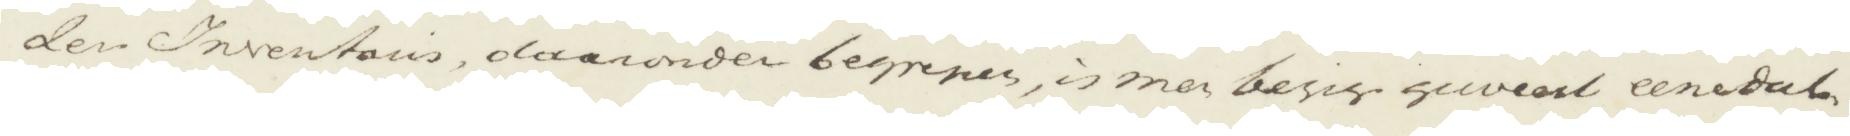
zer Inventaris, daaronder begrepen, is men bezig geweest eene dub
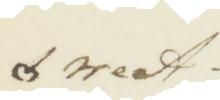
wet
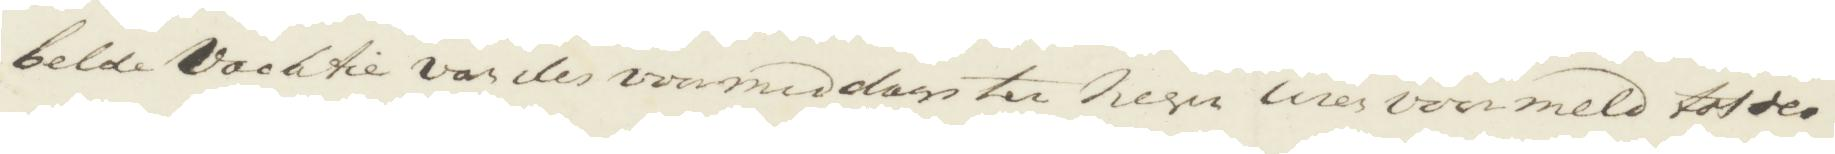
belde vacatie van des voormiddags ten negen uren voormeld tot des
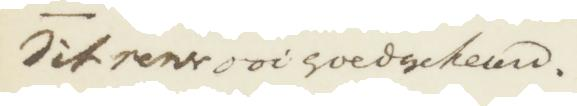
dit renvooi goedgekeurd.
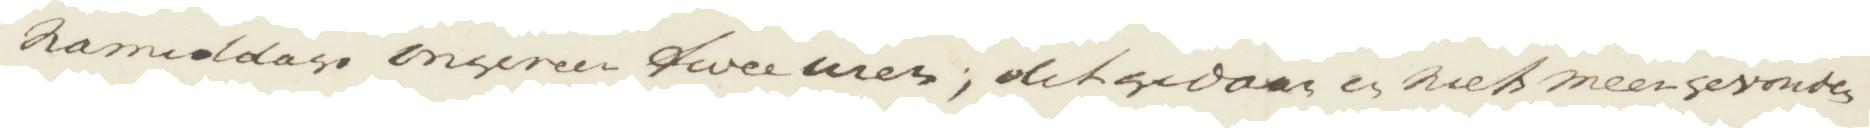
namiddags ongeveer twee uren; dit gedaan en niet meer gevonden
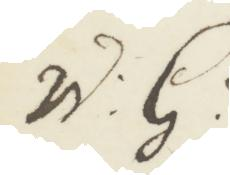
W:G:
